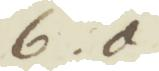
6. d
